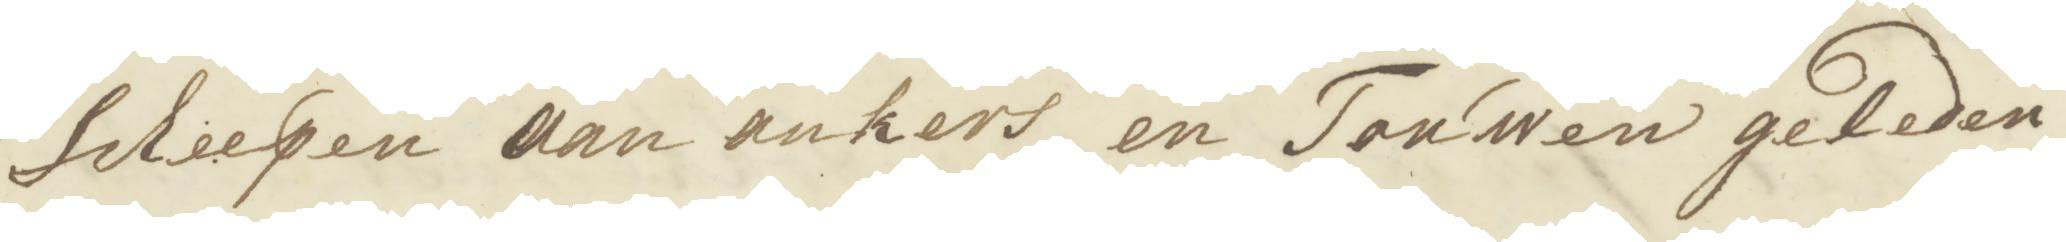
scheepen aan ankers en Touwen geleden
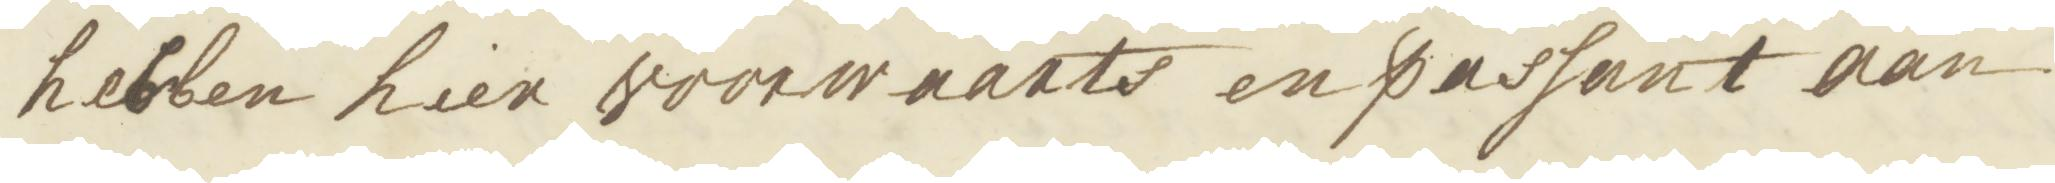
hebben hier voorwaarts en passant aan
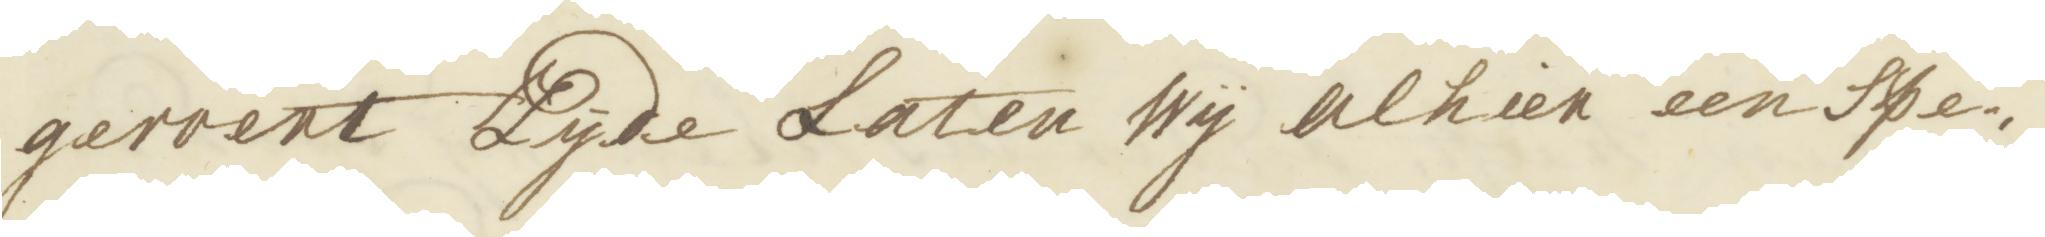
gevoert zijde laten wij alhier een spe„
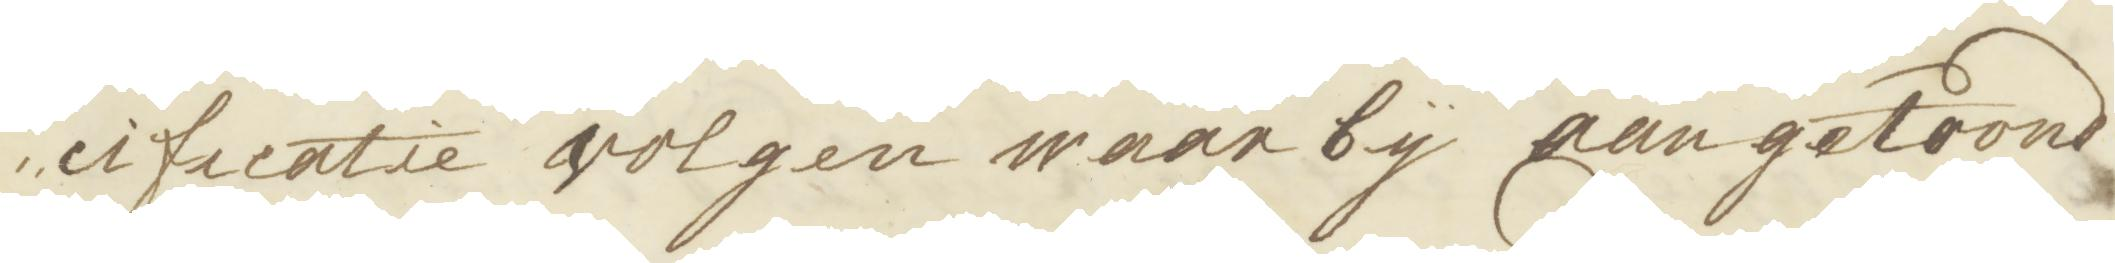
„cificatie volgen waar bij aangetoond
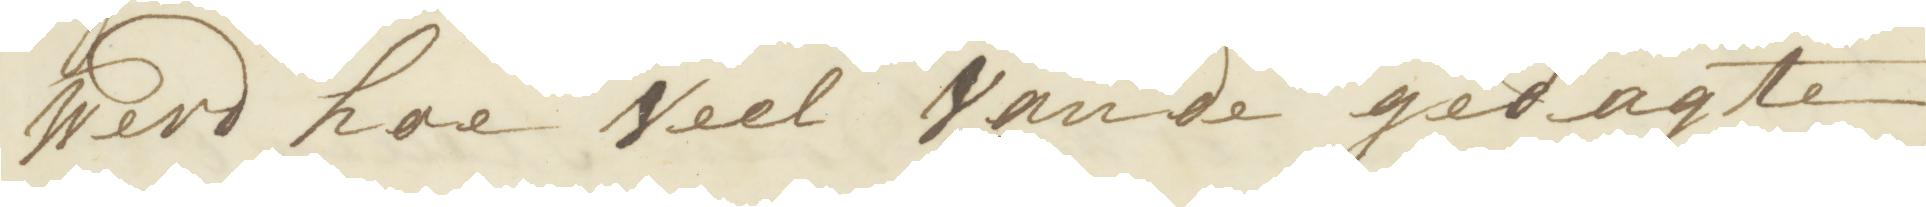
werd hoe veel van de gedagte
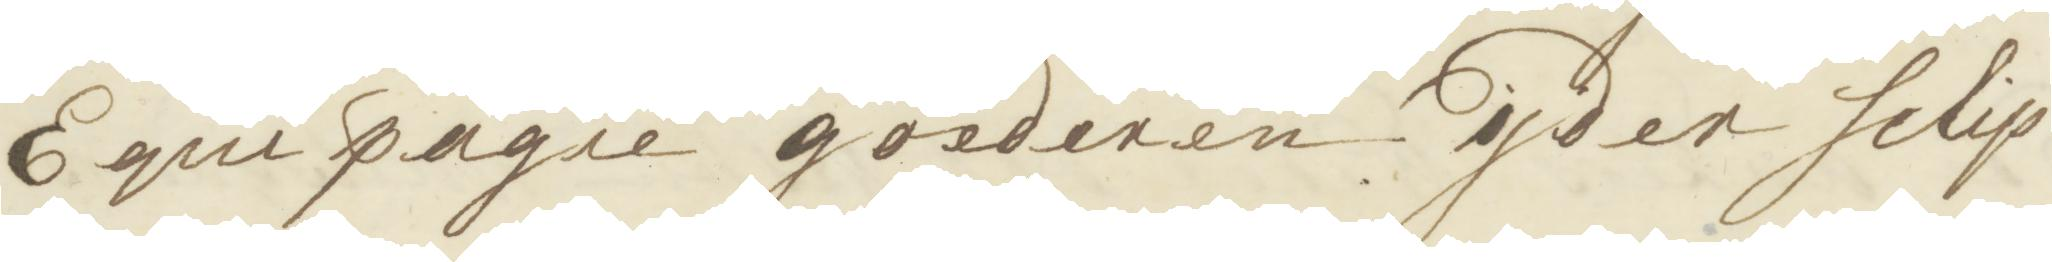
Equipagie goederen ijder schip
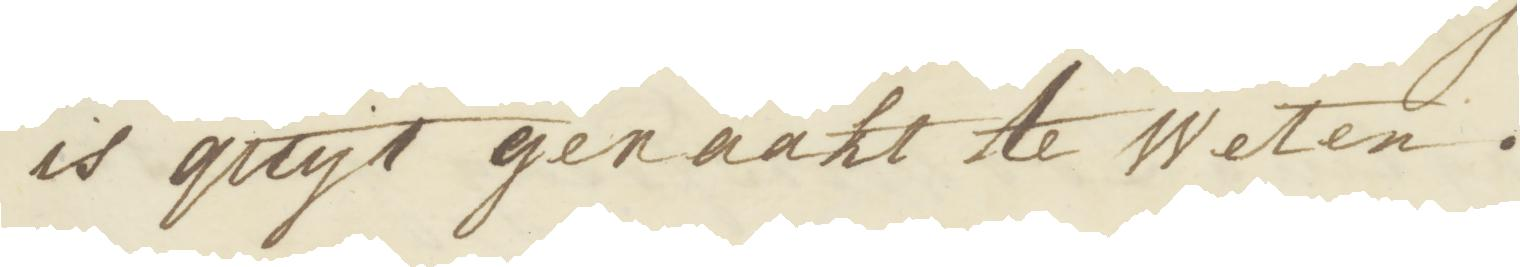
is quijt geraakt te weten.
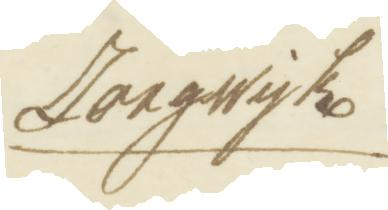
Zorgwijk
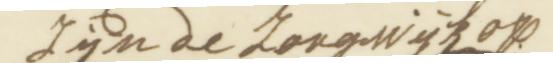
zijn de zorgwijk op
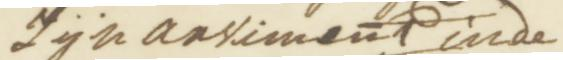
zijn arviment inde
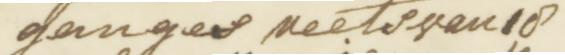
ganges reets van 18
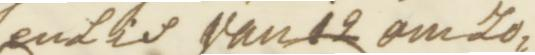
en Lis van 12 om zo„
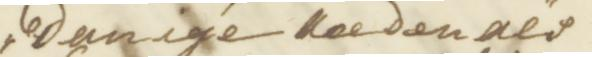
„danige reeden als
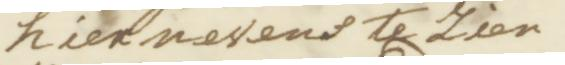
hier nevens te zien
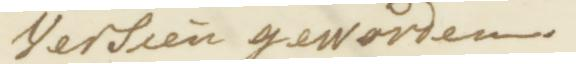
versien geworden
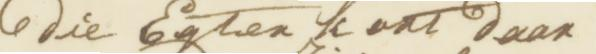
die Egter kort daar
